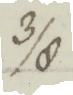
3/8
